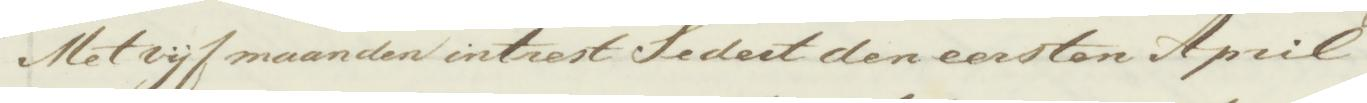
Met vijf maanden intrest Sedert den eersten April
